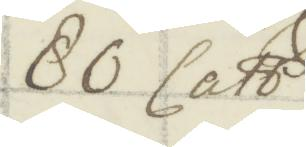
80 Catts
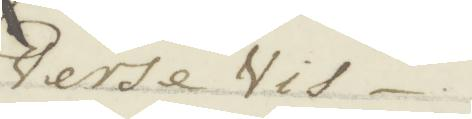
Verse Vis-
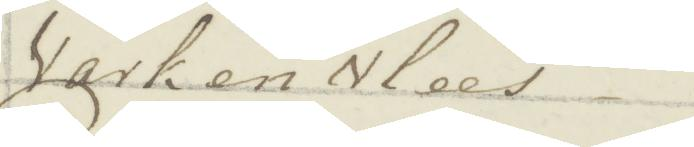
Varken vlees -
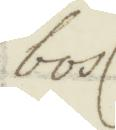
bos
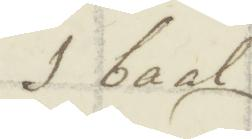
1 baal
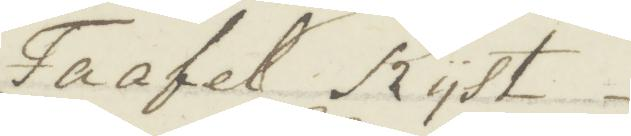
Taafel Rijst
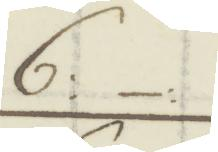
6: -:
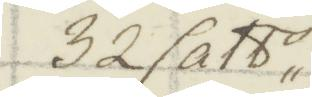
32 Catts„
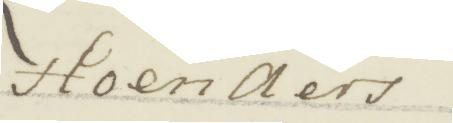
Hoenders
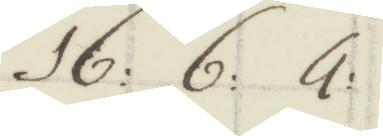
16: 6: 4:
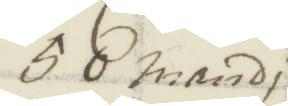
50 mandj
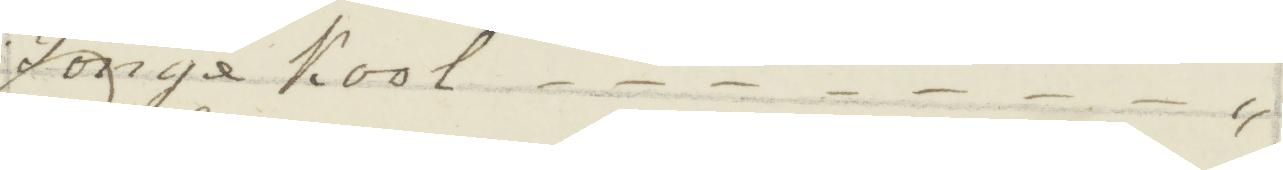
Ionge kool - - - - - - - „
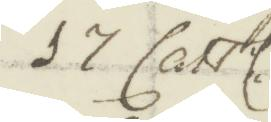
17 Catts
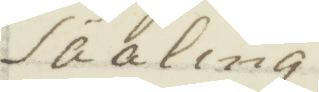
Paaling
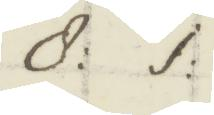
8: 1:
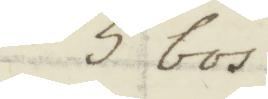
5 bos
